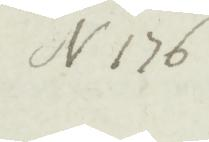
N 176
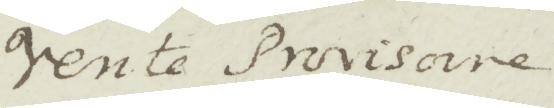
Vente Provisoire
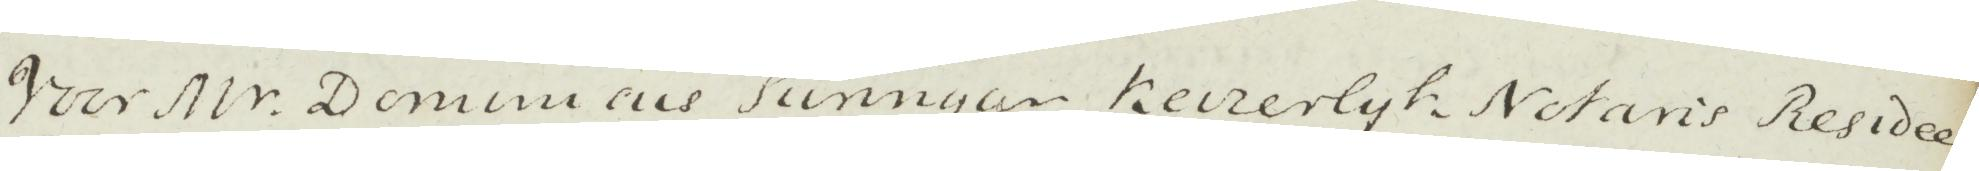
Voor M.r Dominicus Suringar Keizerlyk Notaris Residee
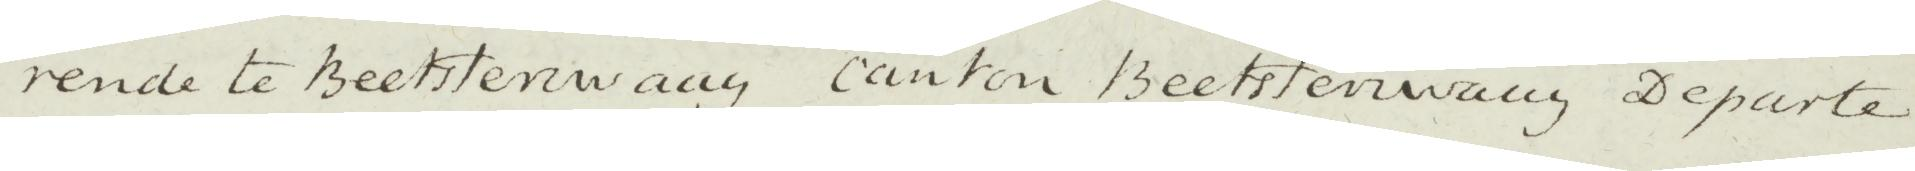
rende te Beetsterzwaag canton Beetsterzwaag Departe
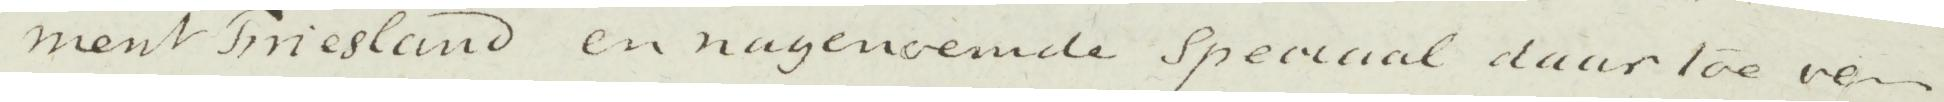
ment Friesland en nagenoemde speciaal daar toe ver
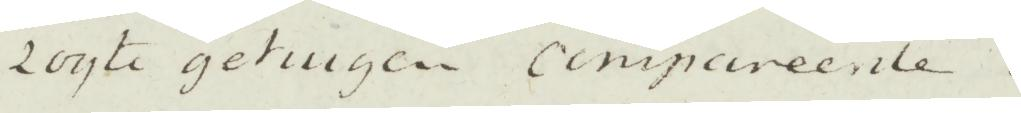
zogte getuigen compareerde
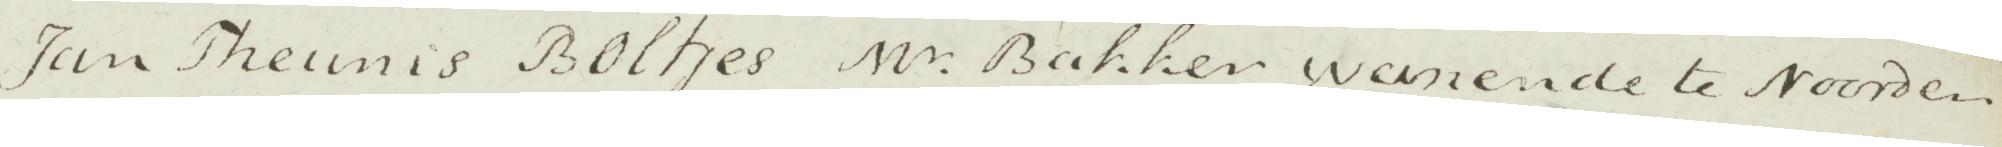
Jan Theunis Boltjes M.r Bakker wonende te Noorder
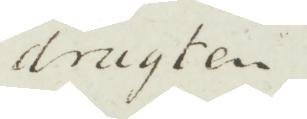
dragten
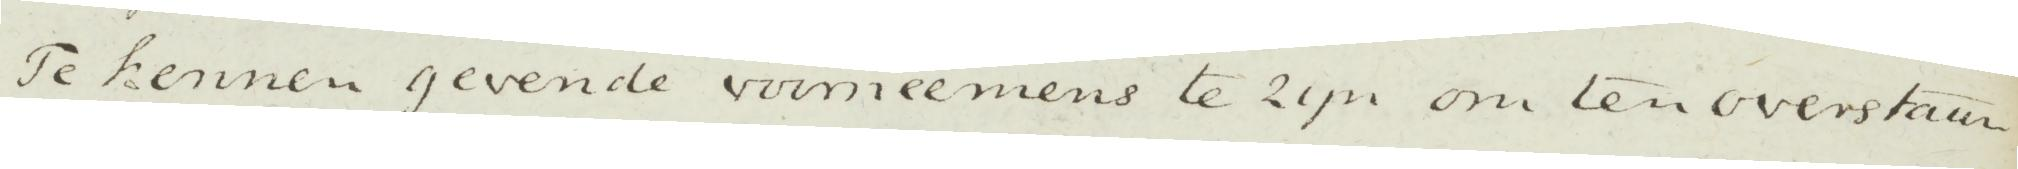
Te kennen gevende voorneemens te zyn om ten overstaan
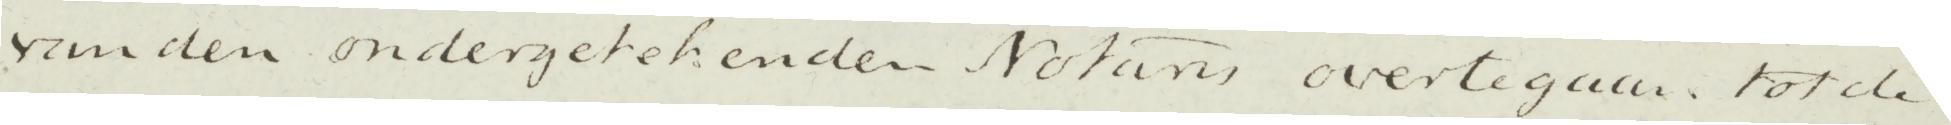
van den ondergetekenden Notaris overtegaan tot de
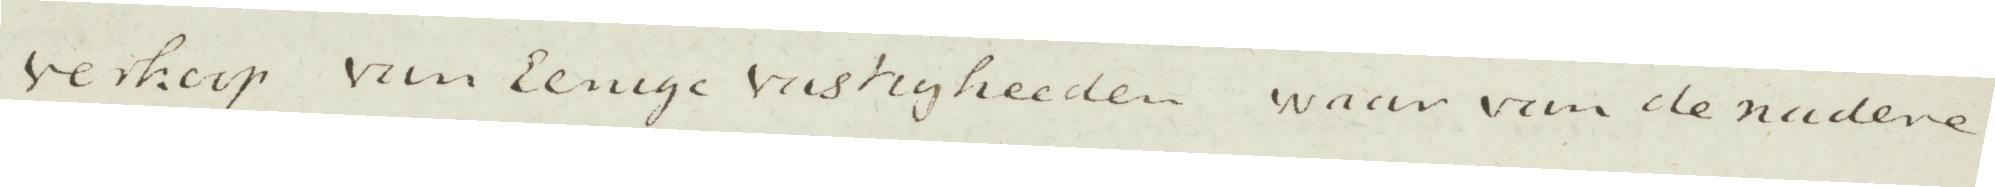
verkoop van Eenige vastigheeden waar van de nadere
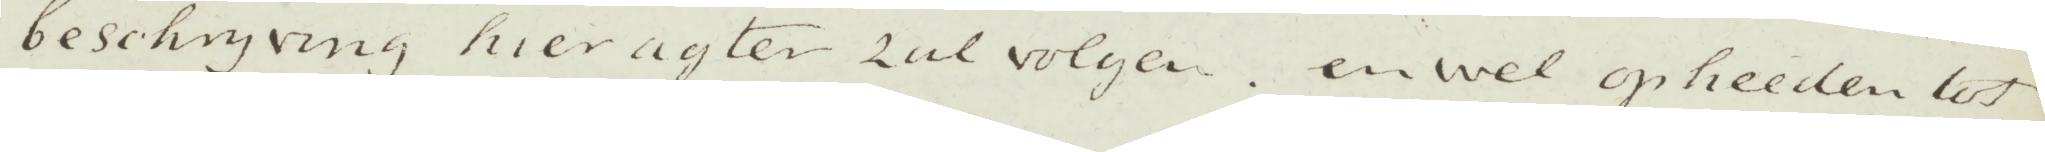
beschryving hier agter zal volgen, en wel opheeden tot
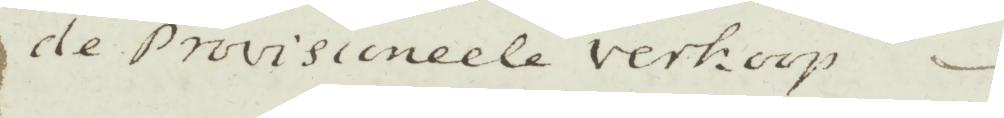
de Provisioneele verkoop
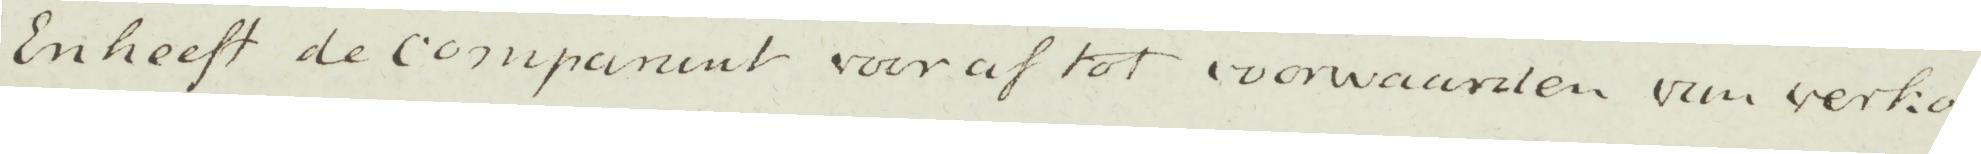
En heeft de comparant vooraf tot voorwaarden van verko=
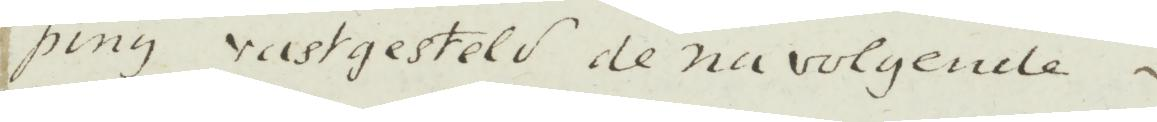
ping vastgesteld de navolgende -
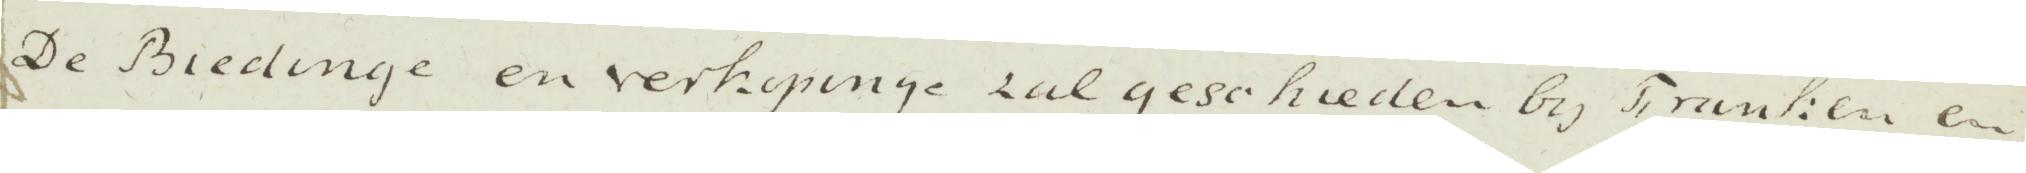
De Biedinge en verkopinge zal geschieden by Franken en
